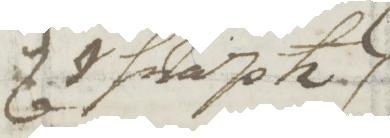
{ 1 snaph
